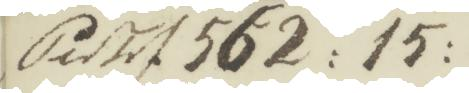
Per Tr ƒ 562: 15:
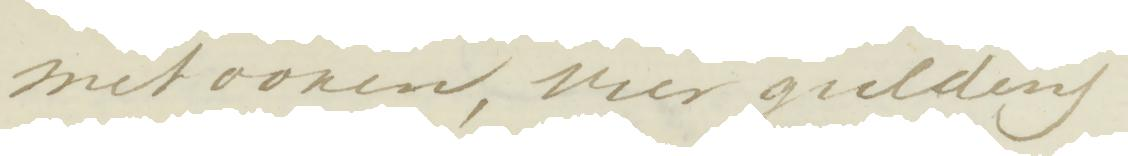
met ooren, vier guldens
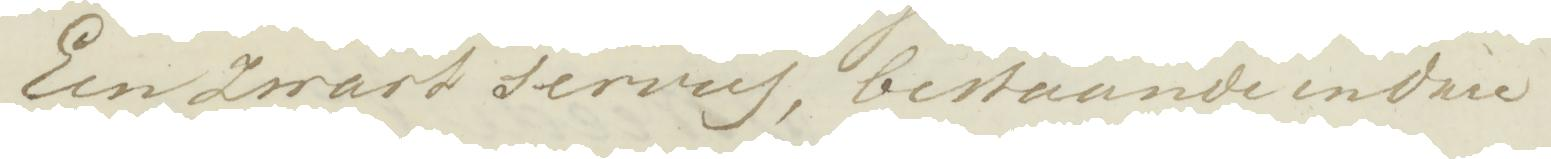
Een zwart servies, bestaande in drie
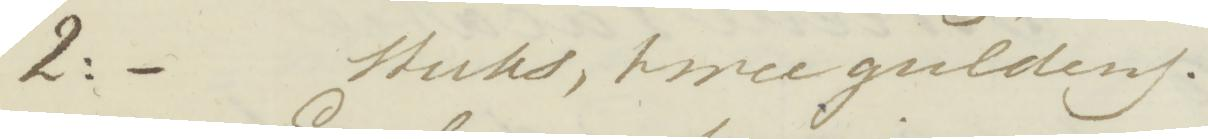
2: — stuks, twee guldens.
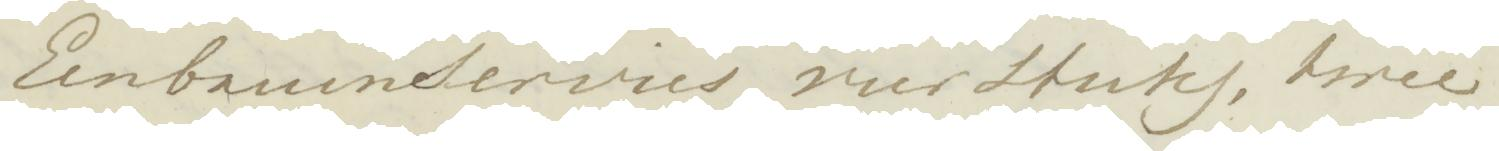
Een bruinservies vier stuks, twee
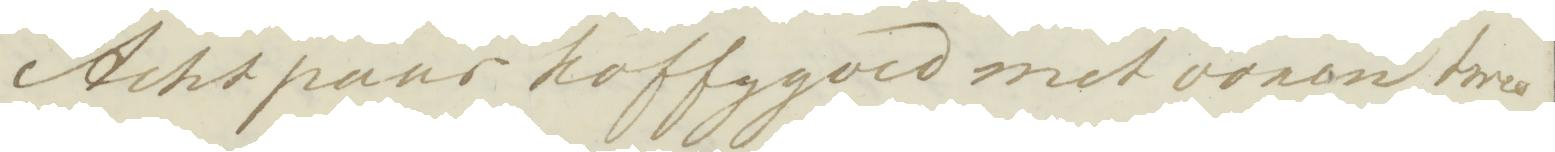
Acht paar koffygoed met voren, twee
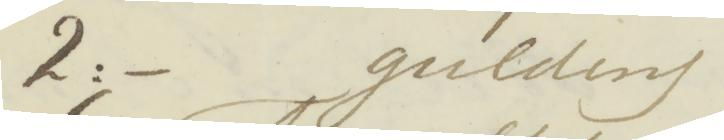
2: — guldens
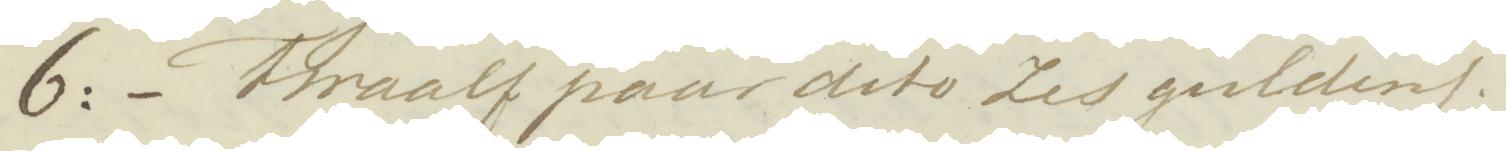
6: — Twaalf paar dito zes guldens.
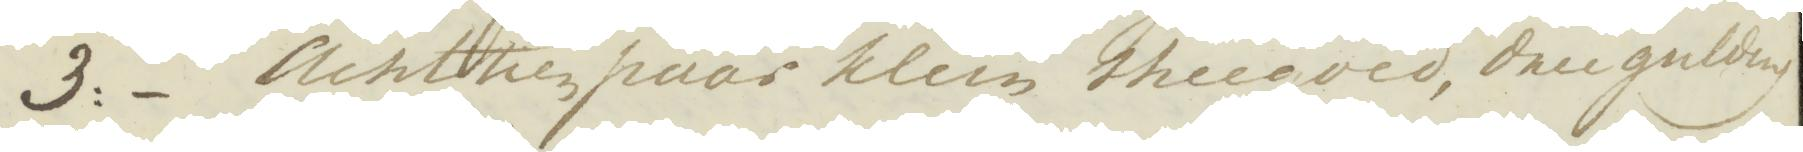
3: — Achttien paar klein theegoed, drie guldens
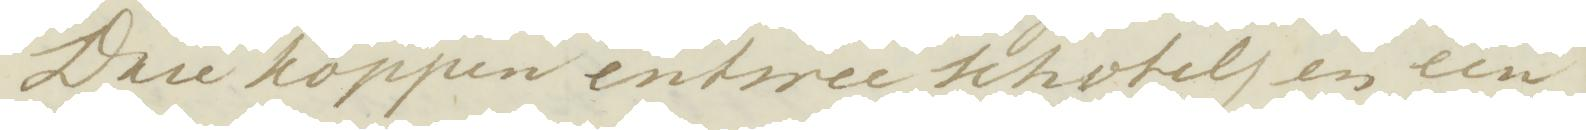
Drie koppen en twee schotels en een
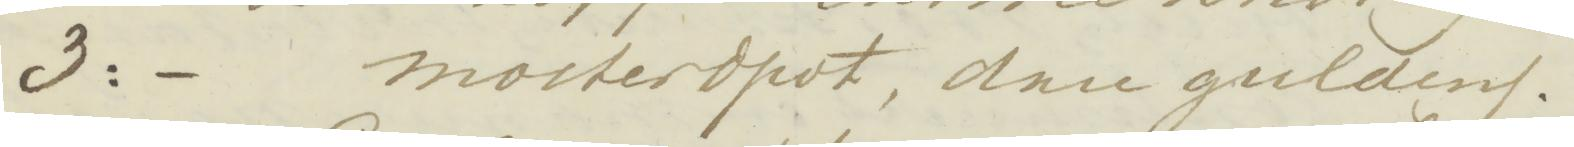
3: — mosterdpot, drie guldens.
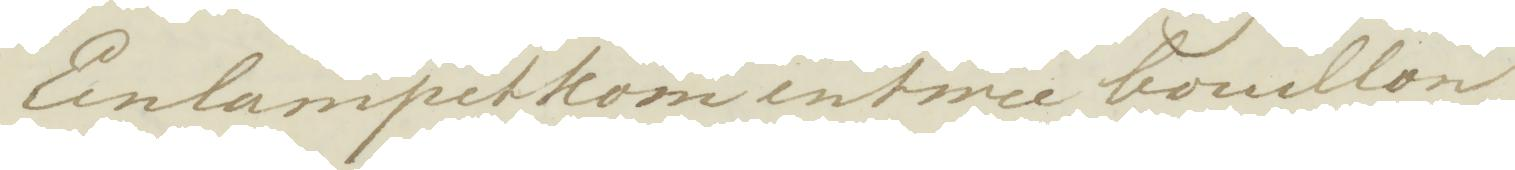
Een lampetkom en twee bouillon
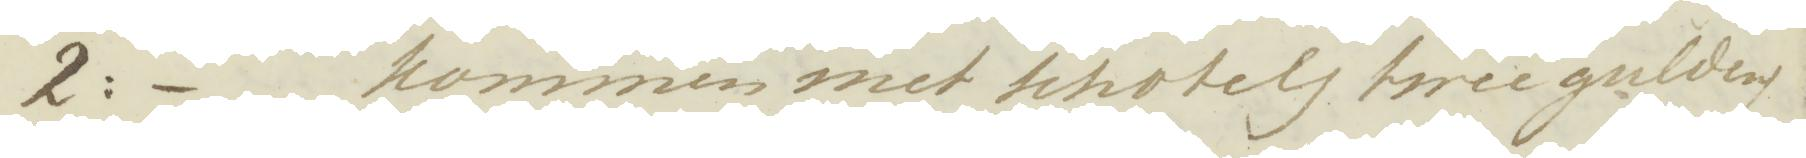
2: — kommen met schotels twee guldens
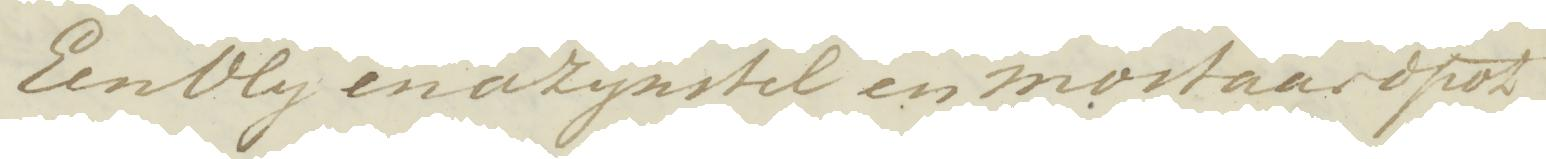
Een Oly en azynstel en mostaardpot
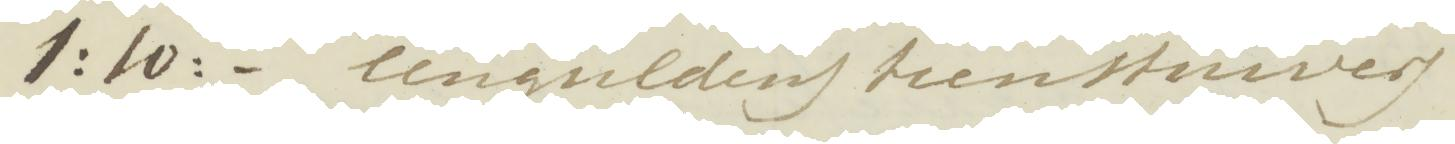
1:10: – een guldens tien stuivers
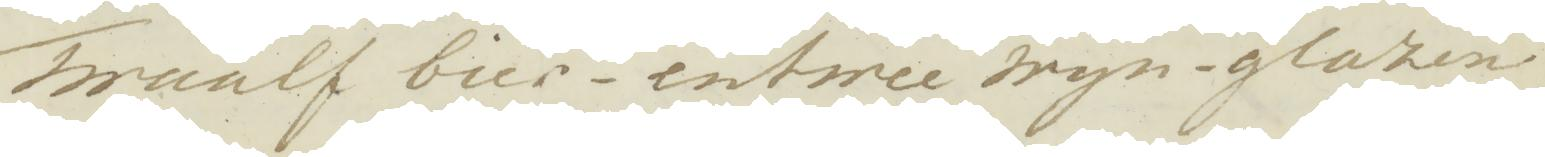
Twaalf bier - en twee wijn - glazen
